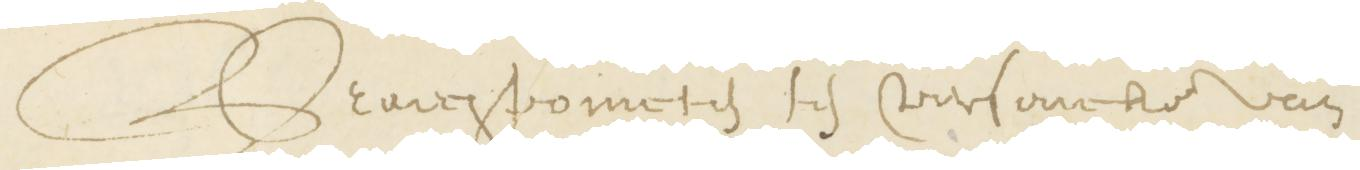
Vraechpoincten ten versoucke van
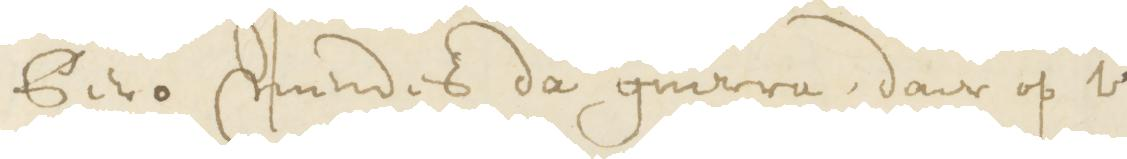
Pero mendes da guerra, daer op te
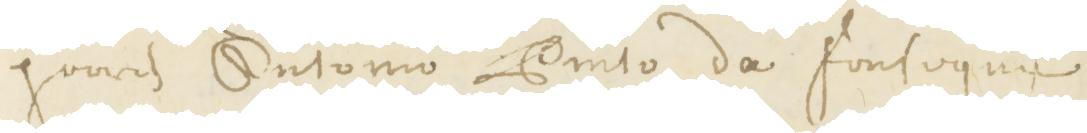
heeren Antonio Pinto da fonsequa
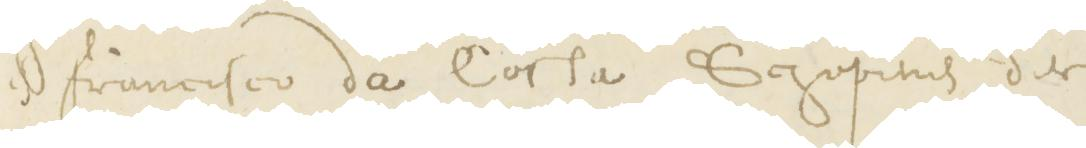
en francisco da Costa Schepenen der
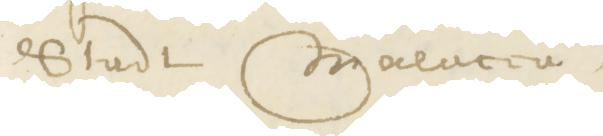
Stadt Malacca
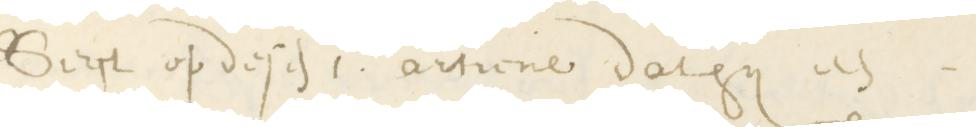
Segt op desen 1.o articul dat hy een —
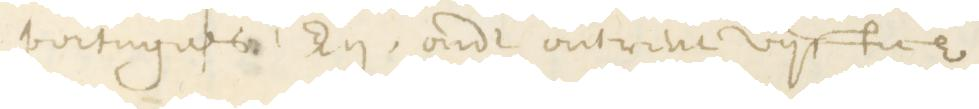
portugees zy, oudt ontrent vyftich
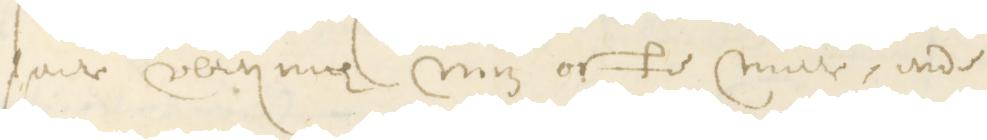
jaer weynich min ofte meer, ende
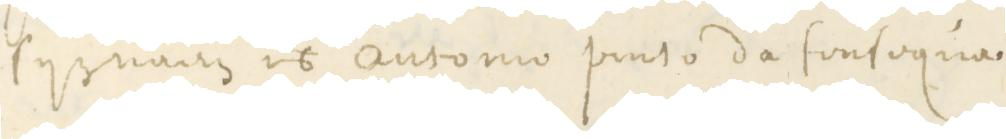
syn naem is antonio pinto da fonsequa
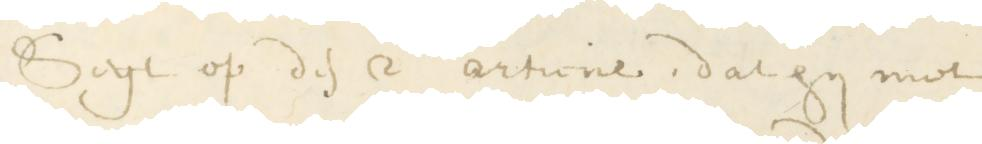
Segt op den 2e articul, dat hy niet
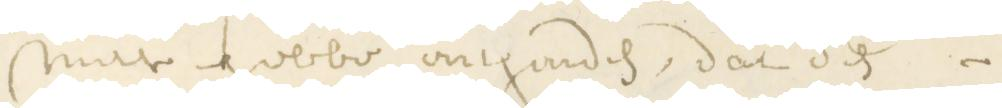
meer hebbe onthouden, dat den —
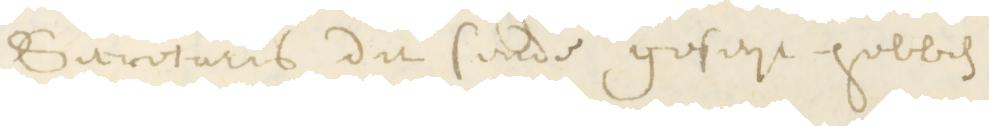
Secretaris dit soude gesegt hebben
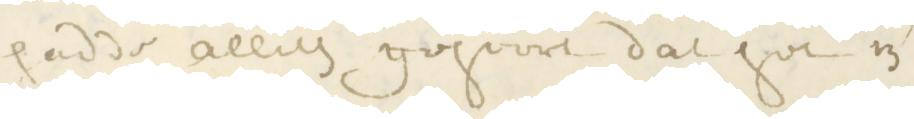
hadde alleen gehoort dat het in
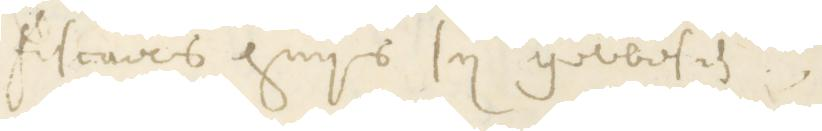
fiscaels huys sy gewesen.
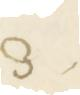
3,
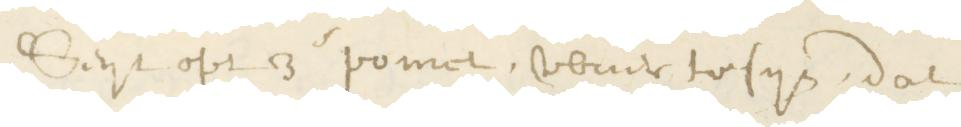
Segt opt 3e poinct, waer te syn, dat
